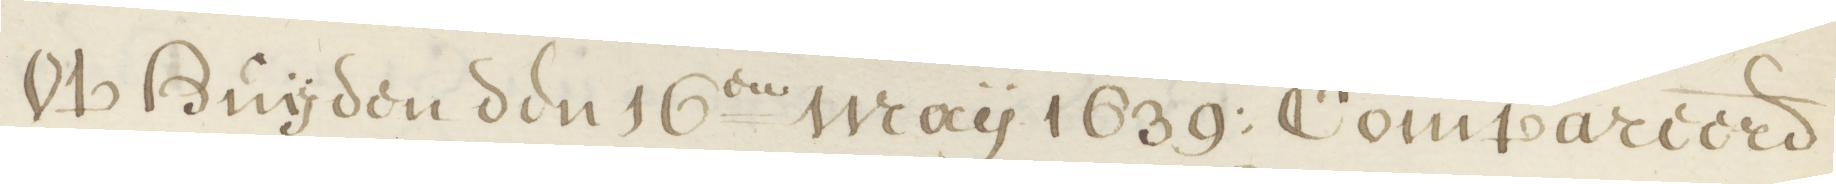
Op huijden den 16=en Maij 1639: Compareerd
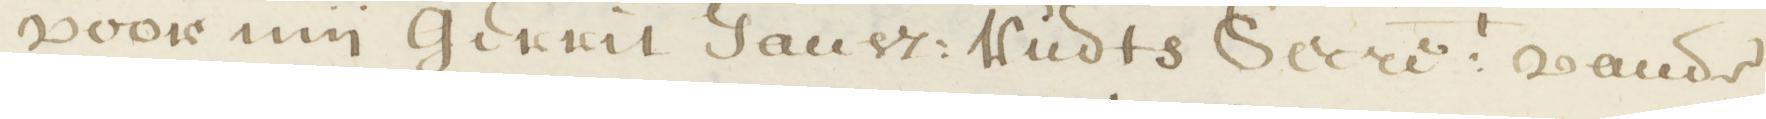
voor mij Gerrit Iansz: tudts Secre:t vande
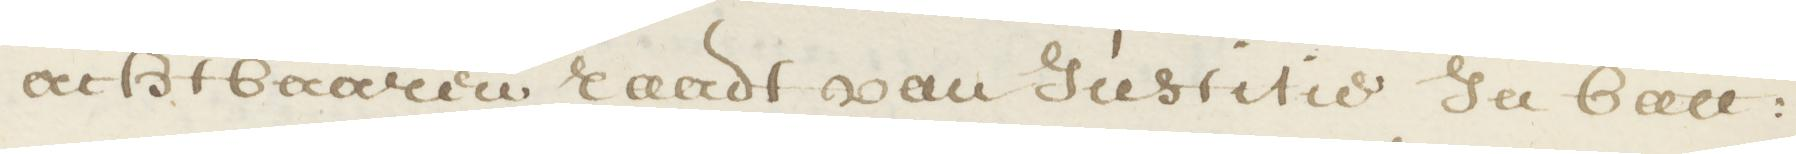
achtbaaren raadt van Iustitie In batt:a
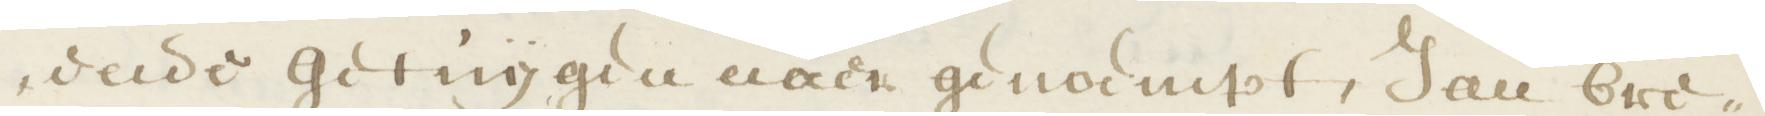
ende getuijgen naer genoempt, Ian bre„
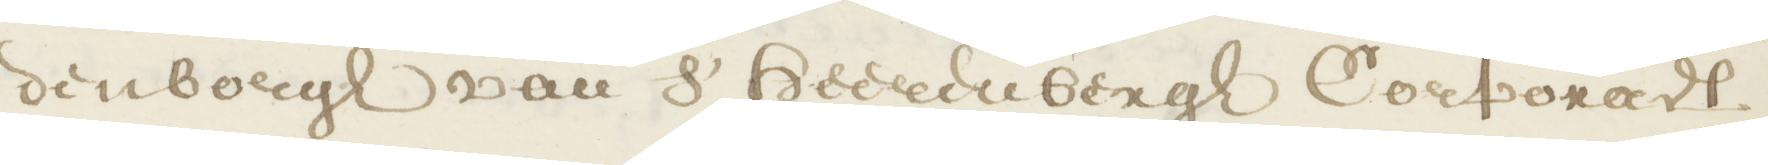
denborgh van s' Heerenbergh Corporael
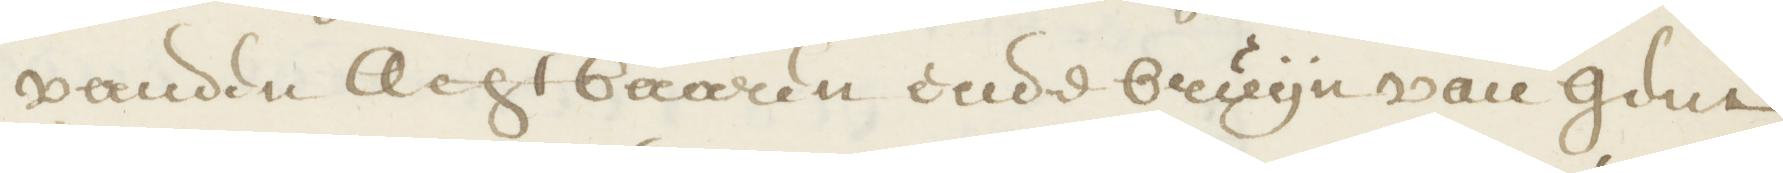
vanden achtbaaren ende bruijn van gent
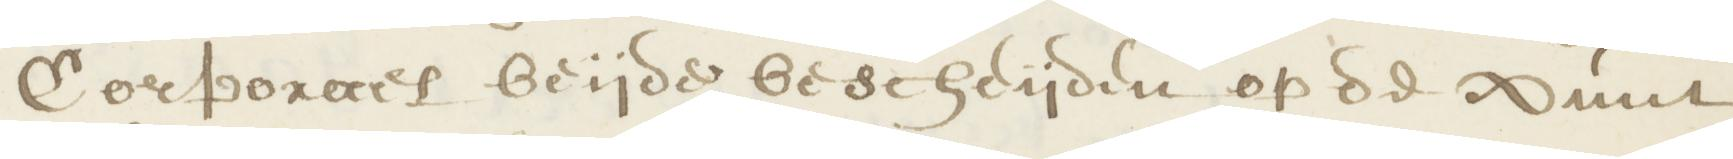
Corporael beijde bescheijden op de punt
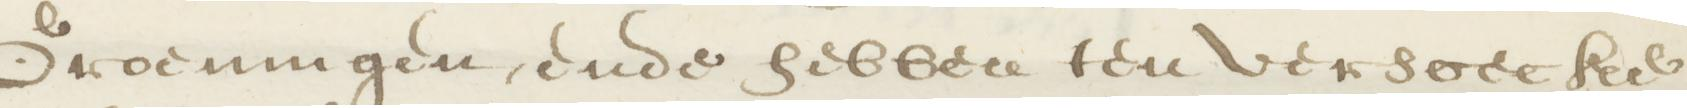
Groeningen, ende hebben ten versoecke
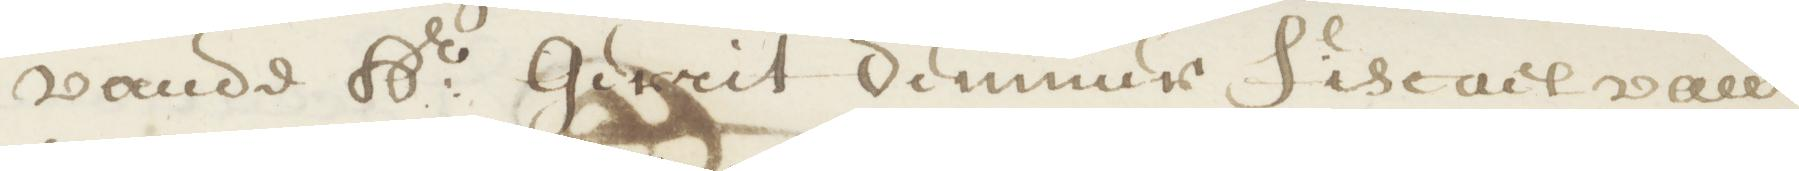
vande h:r Gerrit demmer fiscael vale
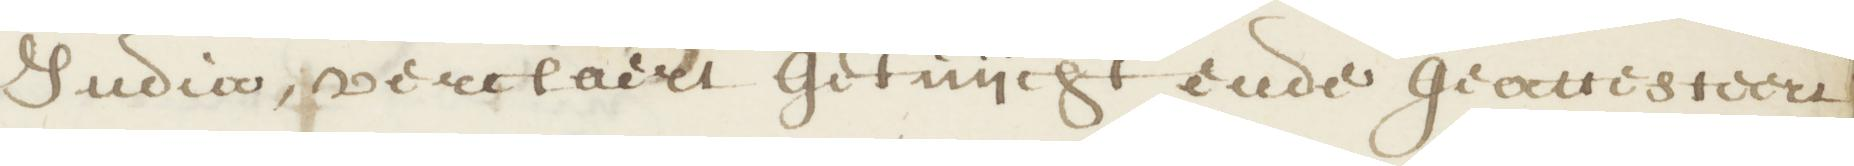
Iudia, verclaert getuijcht ende geattesteert
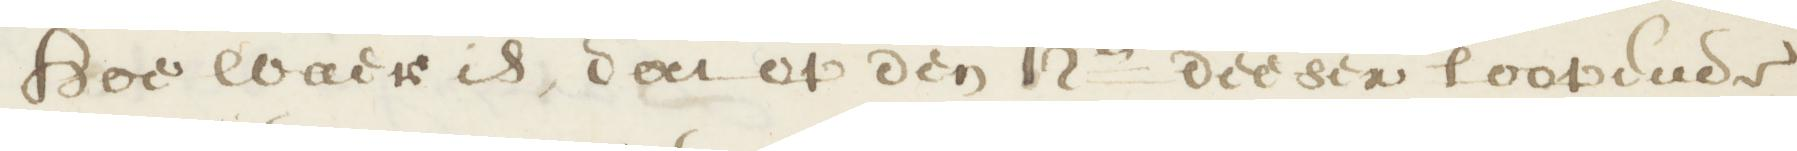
hoe waer is, dat op den 12=en deeser loopende
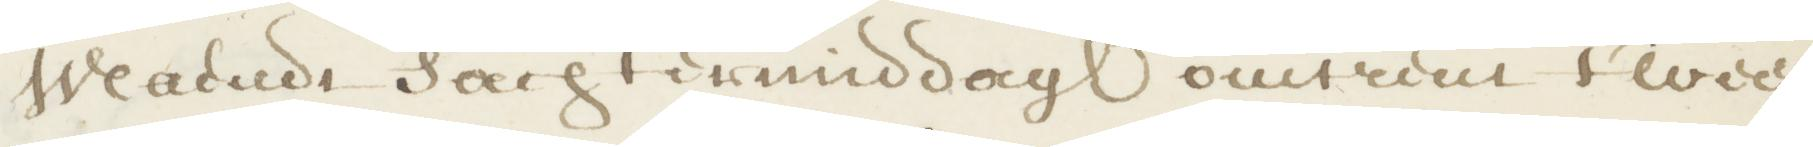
maendt sachtermiddagh omtrent twee
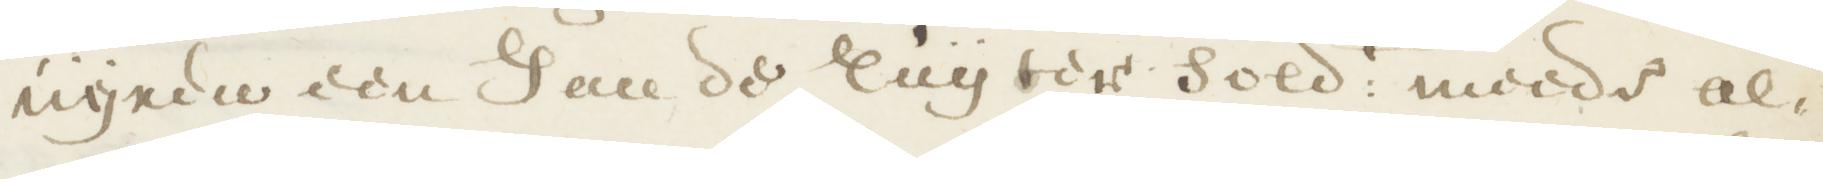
uijren een Iare de ruijter sold:t meede al„
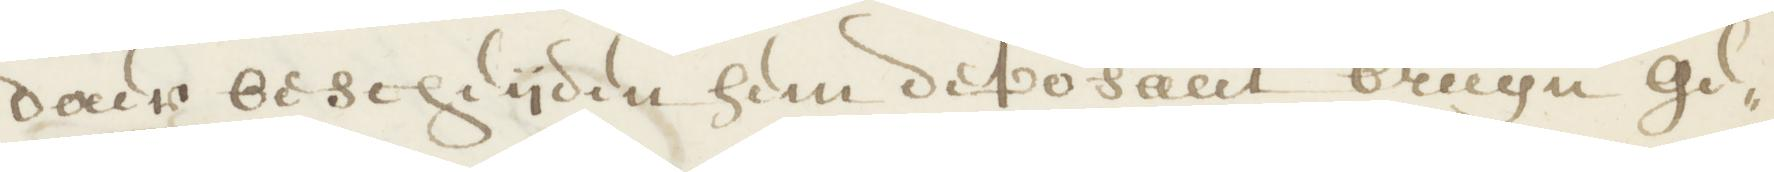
daer bescheijden hem deposant bruijn ge„
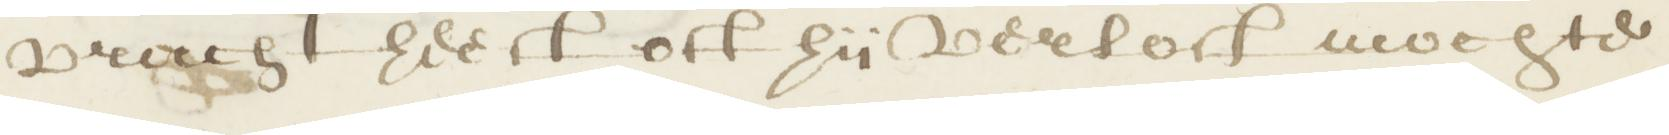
vracht heeft off hij verloff mochte
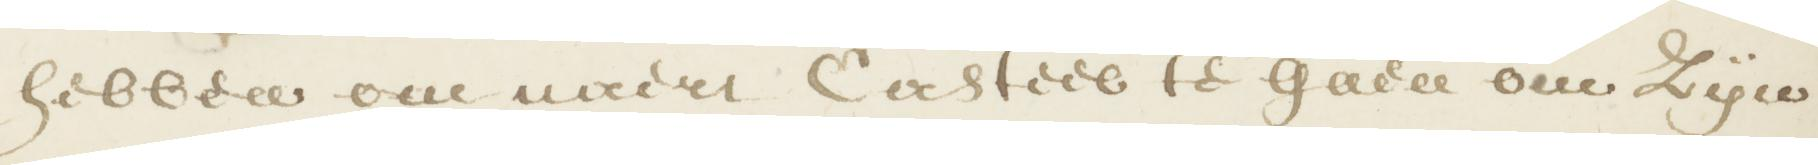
hebben om naert Casteel te gaen om zijn
